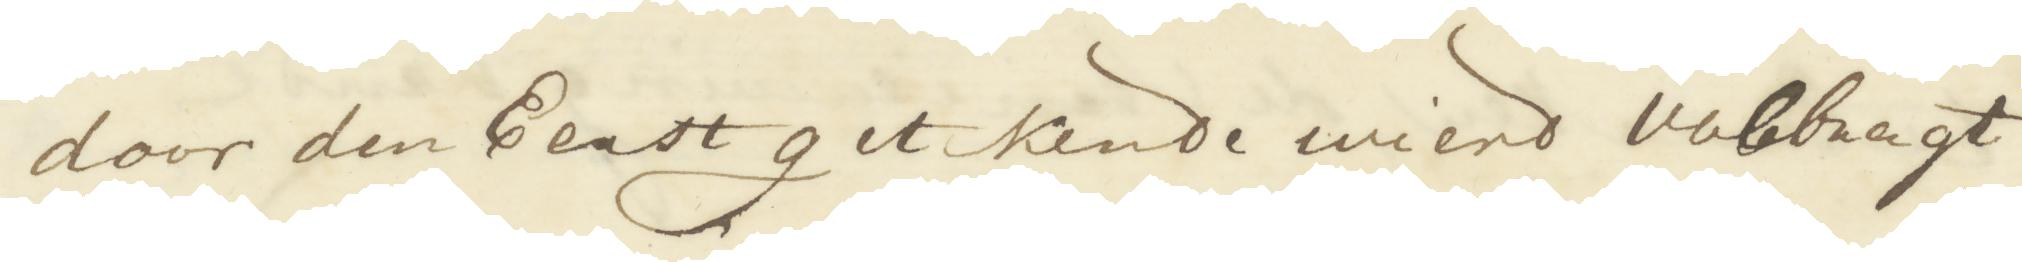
door den Eerst getekende wierd volbragt
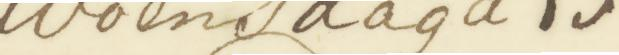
woensdag de 13
